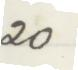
0
